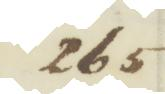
265
